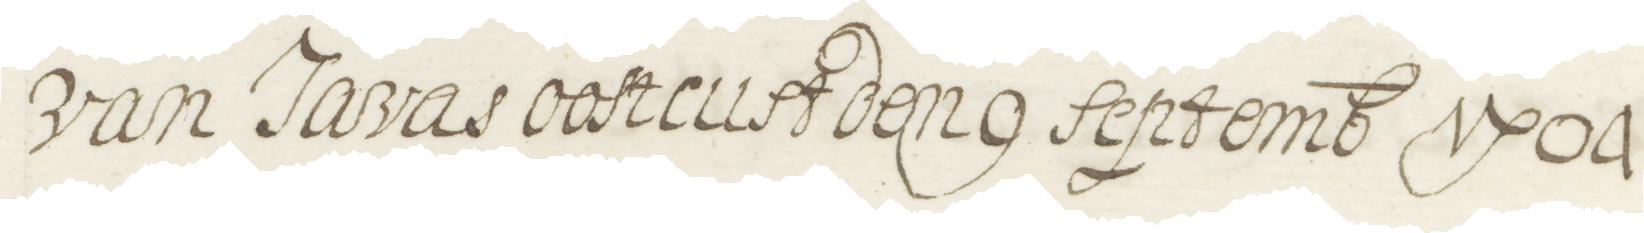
van Iavas oostcust den 9 septemb 1704
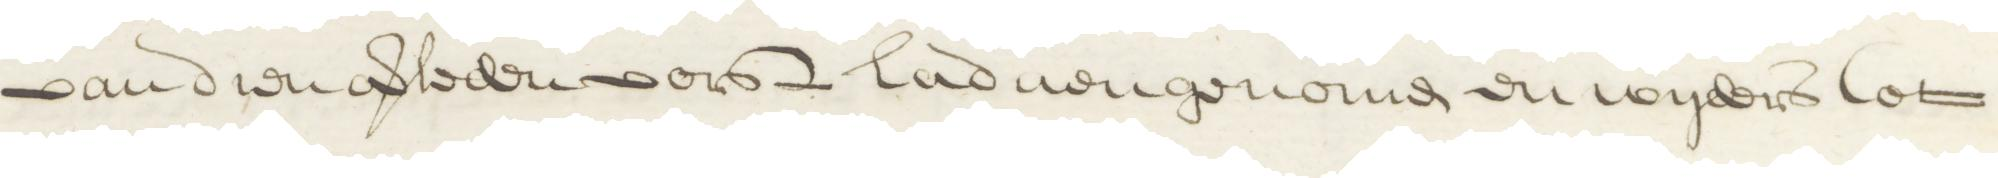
van dien overleden vorst had aengenomen en wyders tot
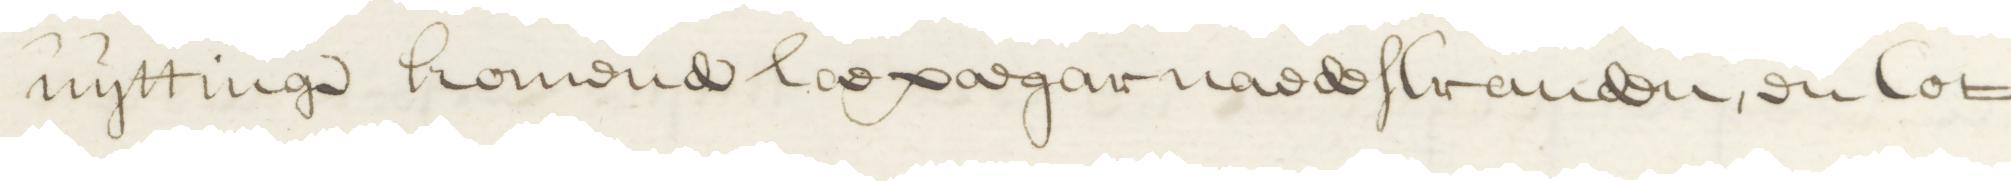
uijttinge komende hoe poegar nae de stranden, en tot
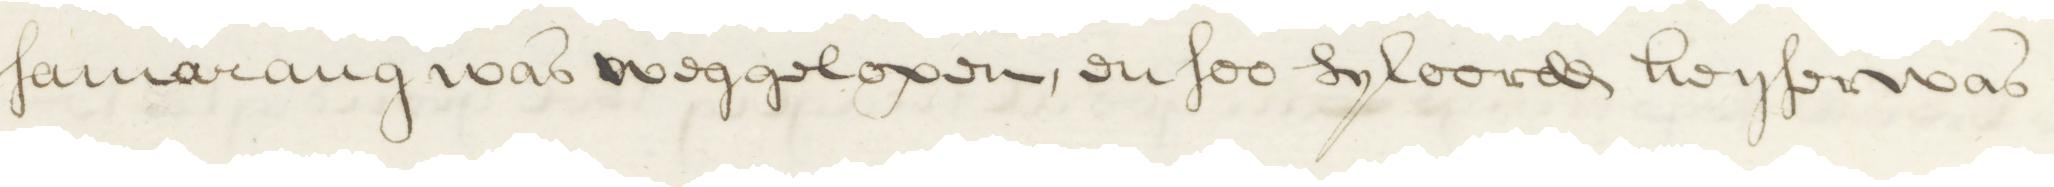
samarang was weg gelopen, en soo sy hoorden keyser was
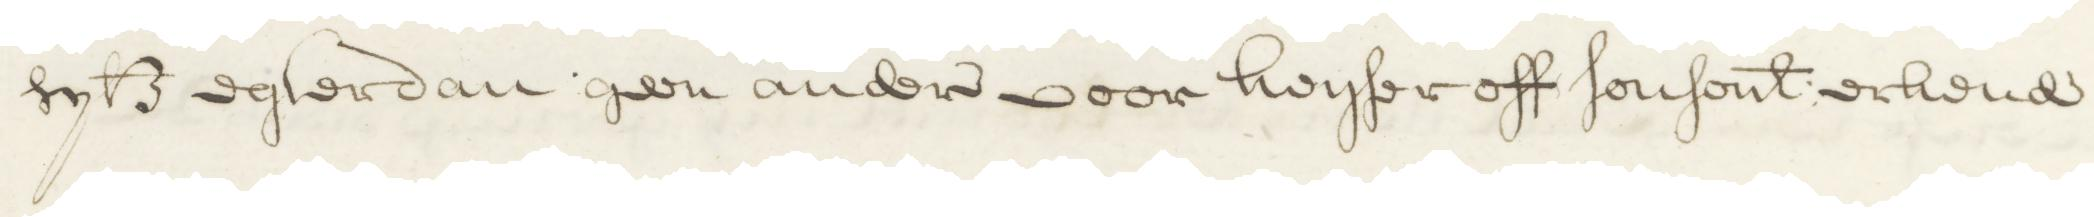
sylijk egter dan geen ander voor keyser off sousouh: erkende
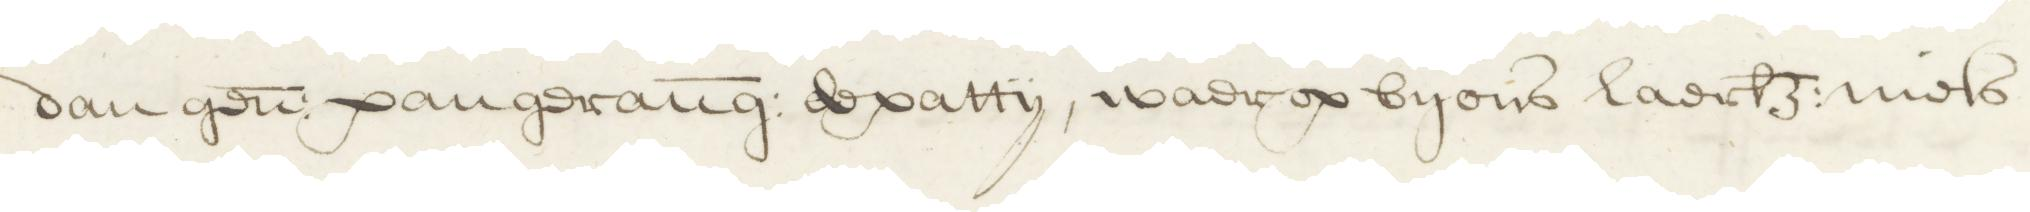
dan gen: pangerang: de pattij, waer op by ons haerlijk: niets
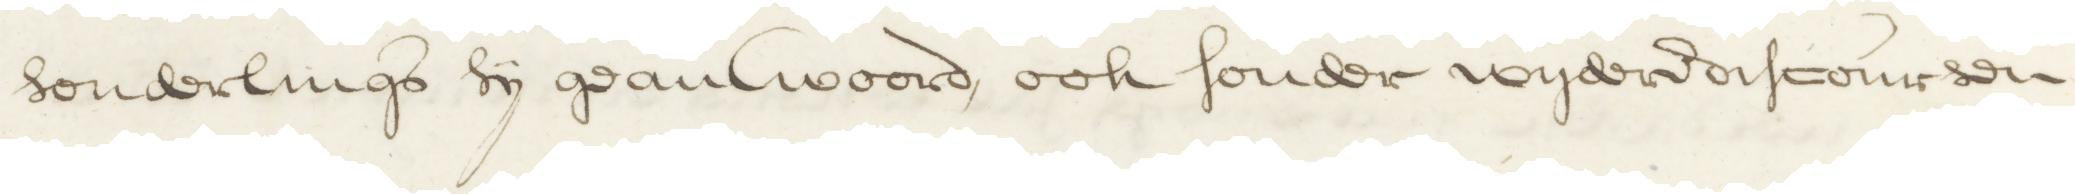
sonderlings sij geantwoord, ook sonder wydere discoursen
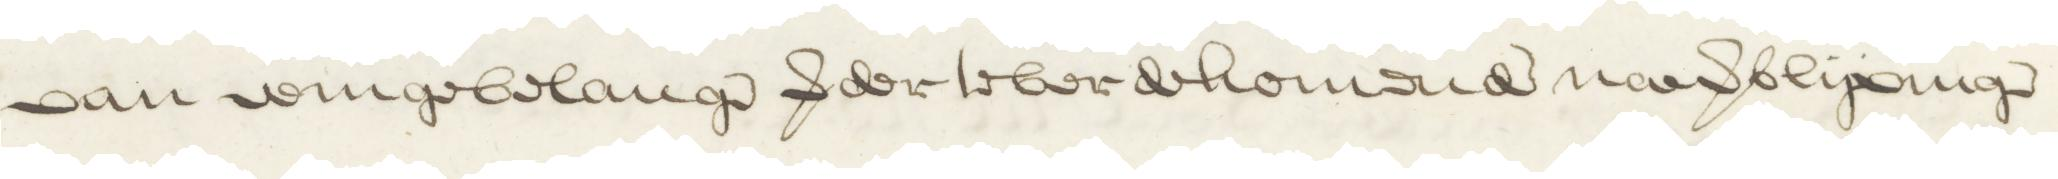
van eenige belange verder te berde komende nae verblijvinge
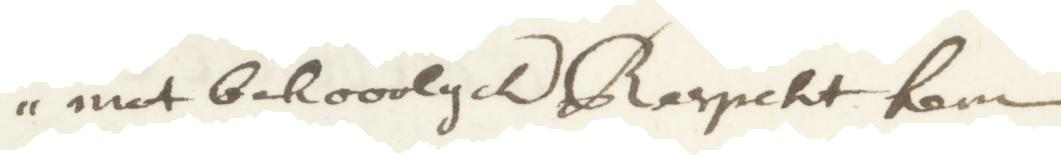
„ met behoorlyck Respekt hem
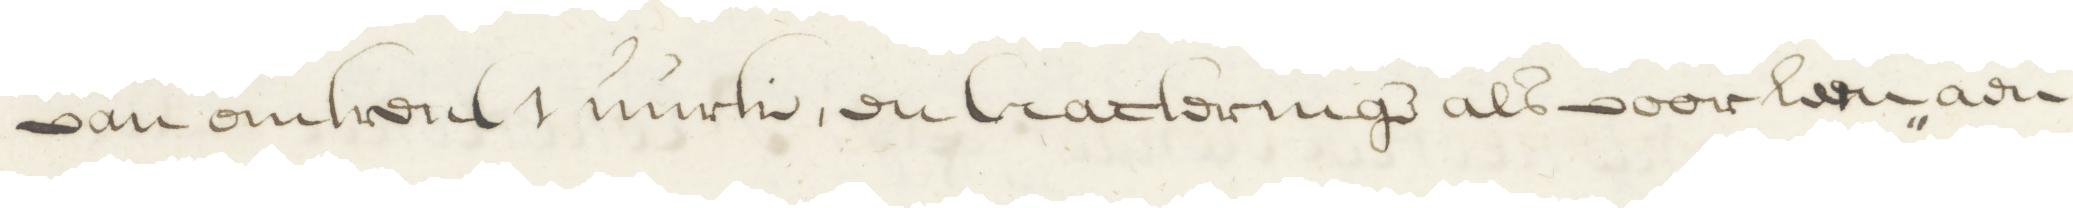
van omtrent 1 uurtie, en tracteringe als voor heen „ aen
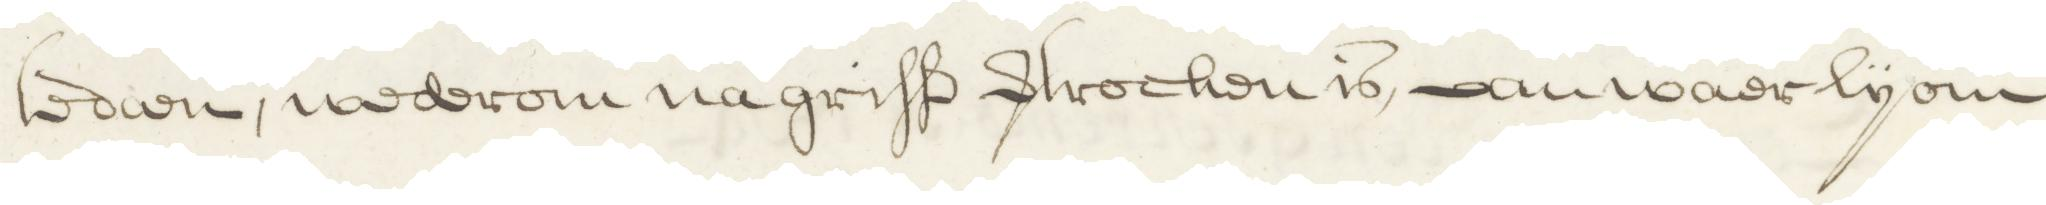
te doen, wederom na grisse vertrocken is, van waer hij om
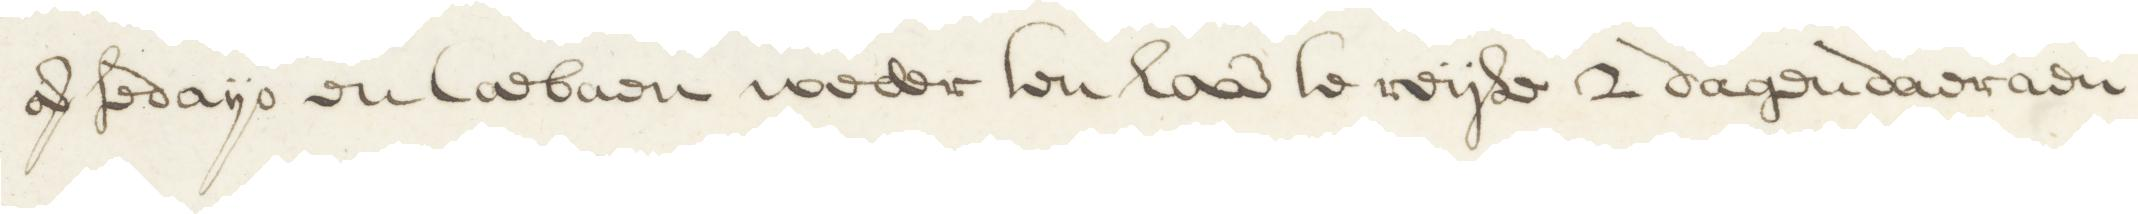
over sedaijo en toebaen weder ten have te reijse 2 dagen daer aen
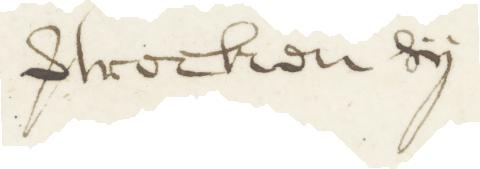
vertrocken sij
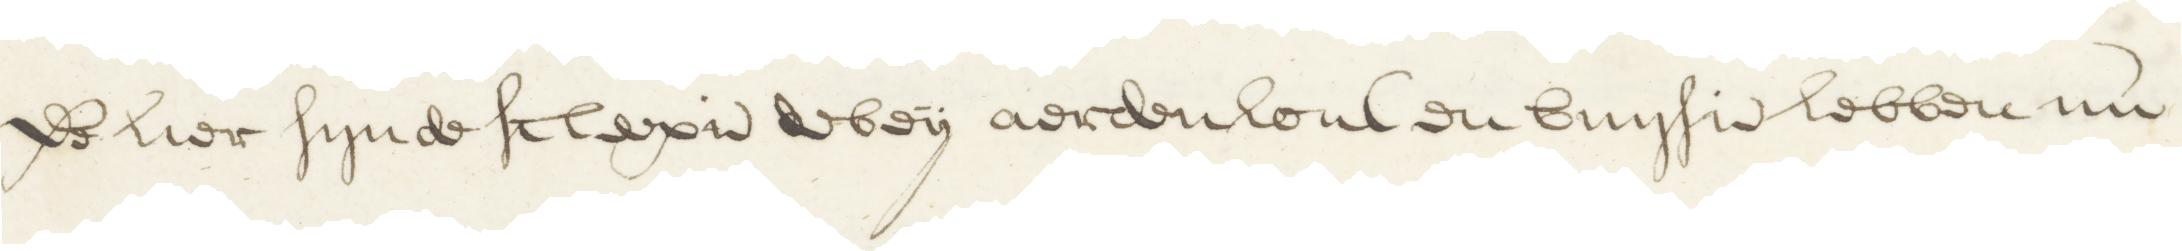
ve hier synde scheepie de beij aerdenhout en buysie hebben nu
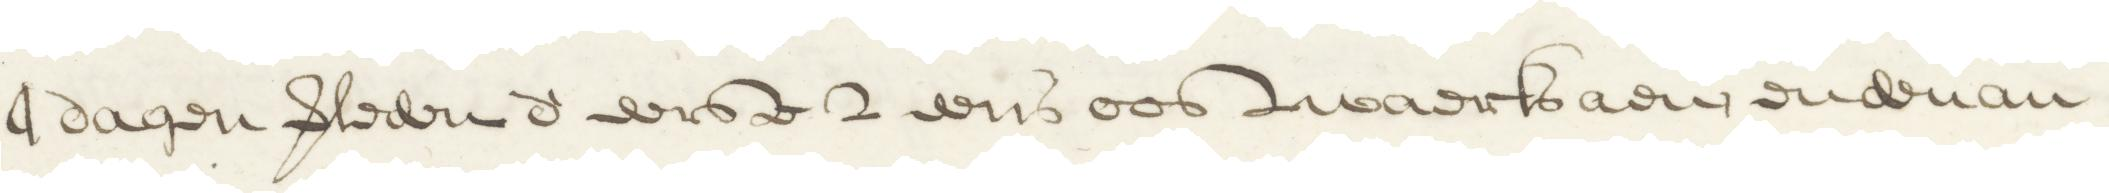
4 dagen verleden d’eerste 2 eens oostwaerts aen, en den an
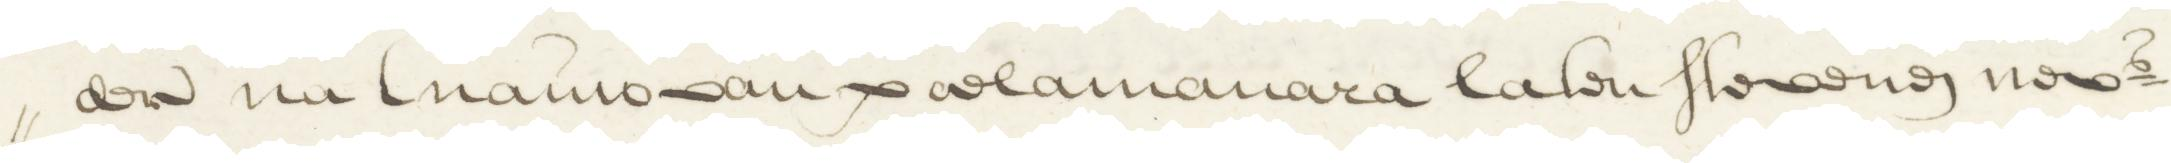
„ der na t nauw van poelamanara laten stevenen nev=s
